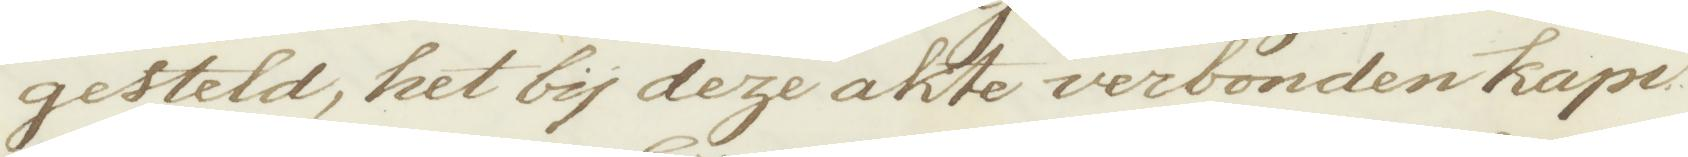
gesteld, het bij deze akte verbonden kapi,
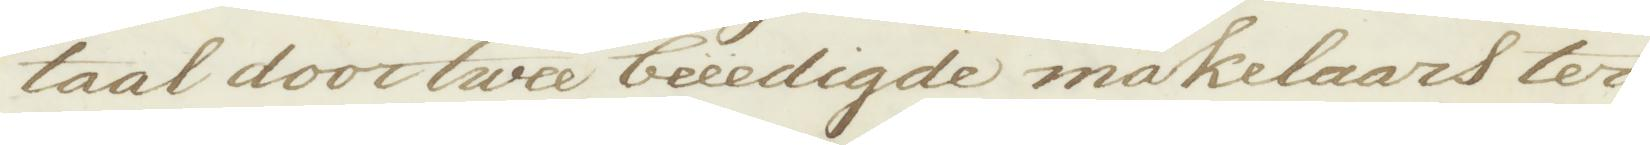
taal door twee beëedigde makelaars ter
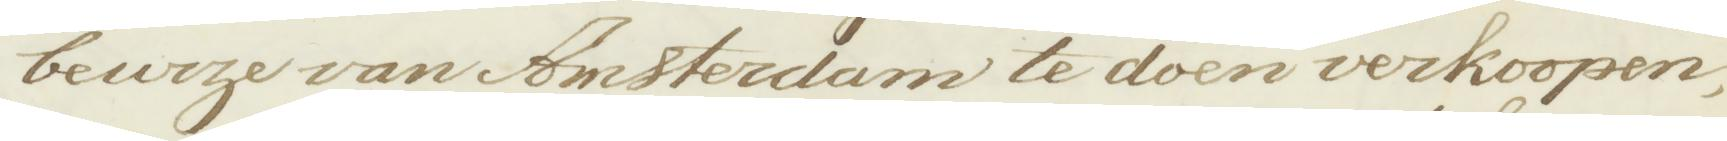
beurze van Amsterdam te doen verkoopen
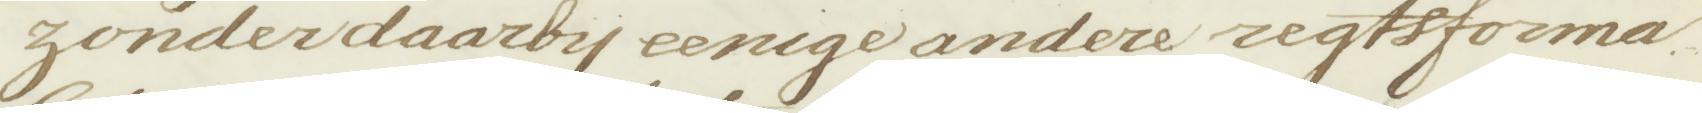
zonder daarbij eenige andere regtsforma.
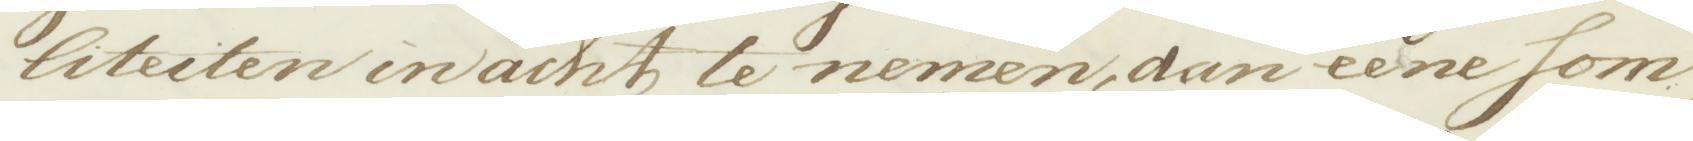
liteiten in acht te nemen, dan eene som..
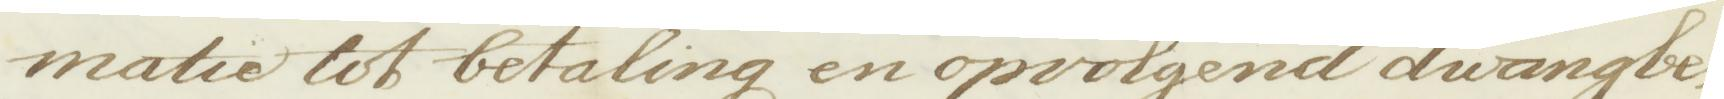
matie tot betaling en opvolgend dwang be,
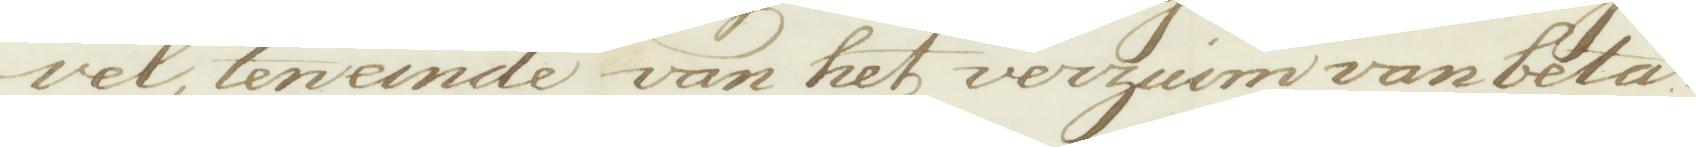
vel, ten einde van het verzuim van beta.
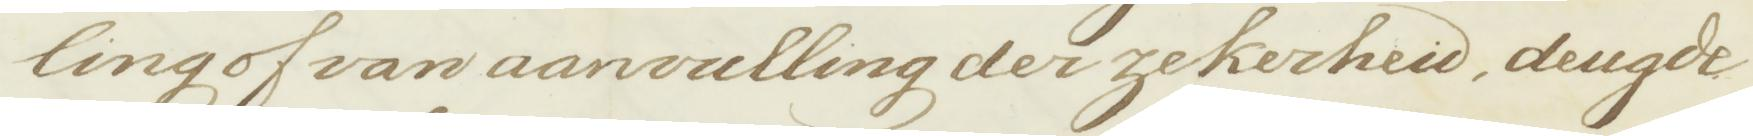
ling of van aanvulling der zekerheid, deugde
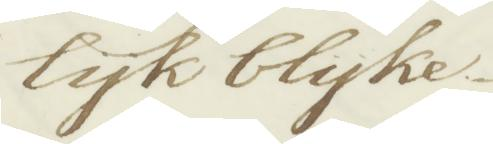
lijk blijke.
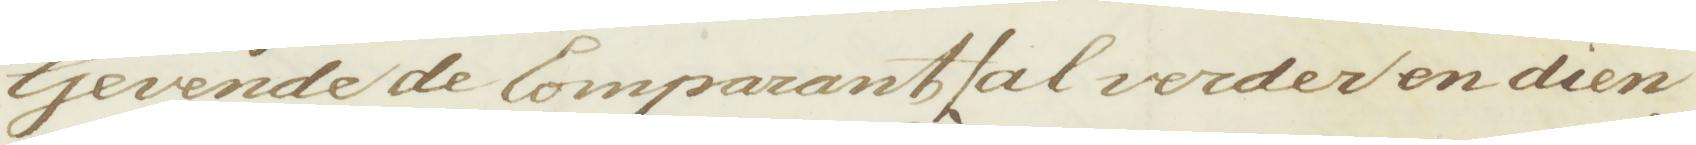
Gevende de Comparant al verder en dien
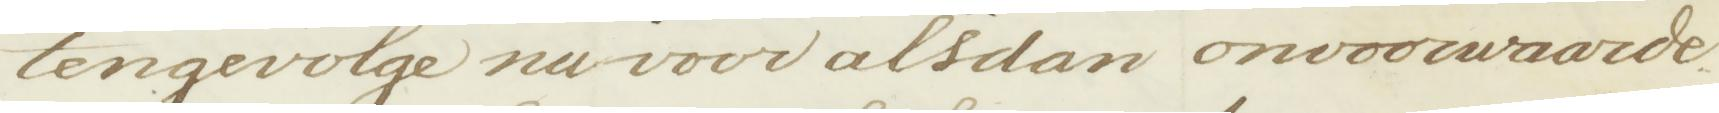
tengevolge nu voor alsdan onvoorwaarde„
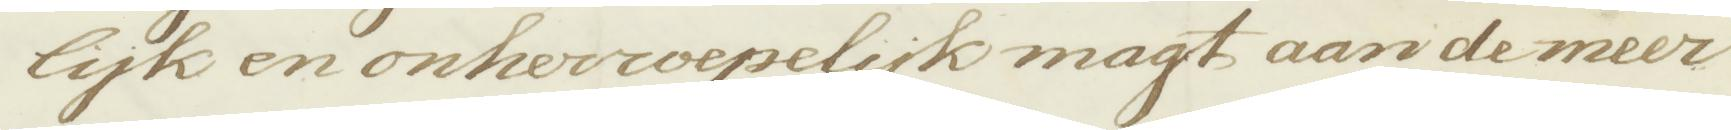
lijk en onherroepelijk magt aan de meer„
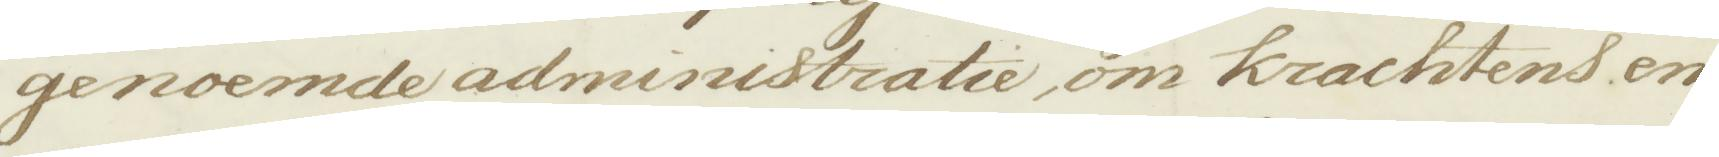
genoemde administratie, om krachtens en
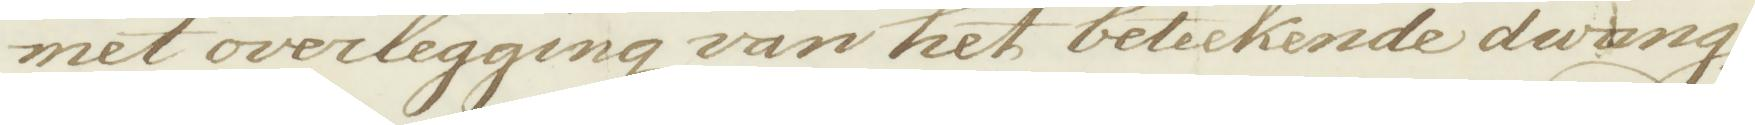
met overlegging van het beteekende dwang„
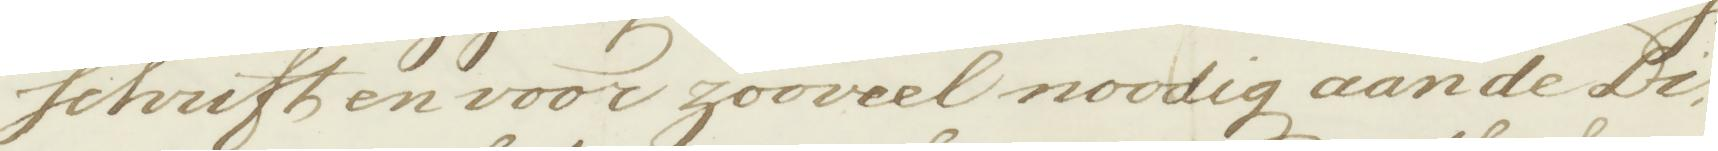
schrift en voor zooveel noodig aan de Di,
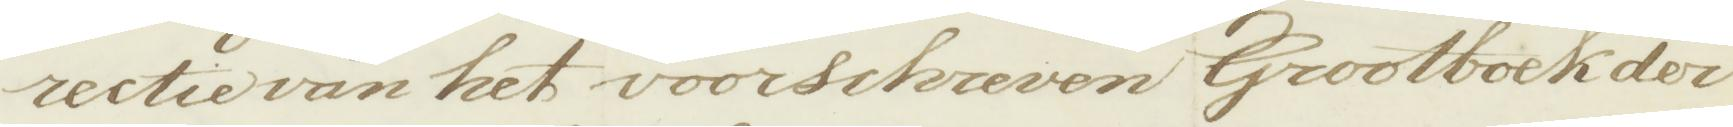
rectie van het voorschreven Grootboek der
